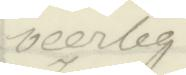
veerteg
